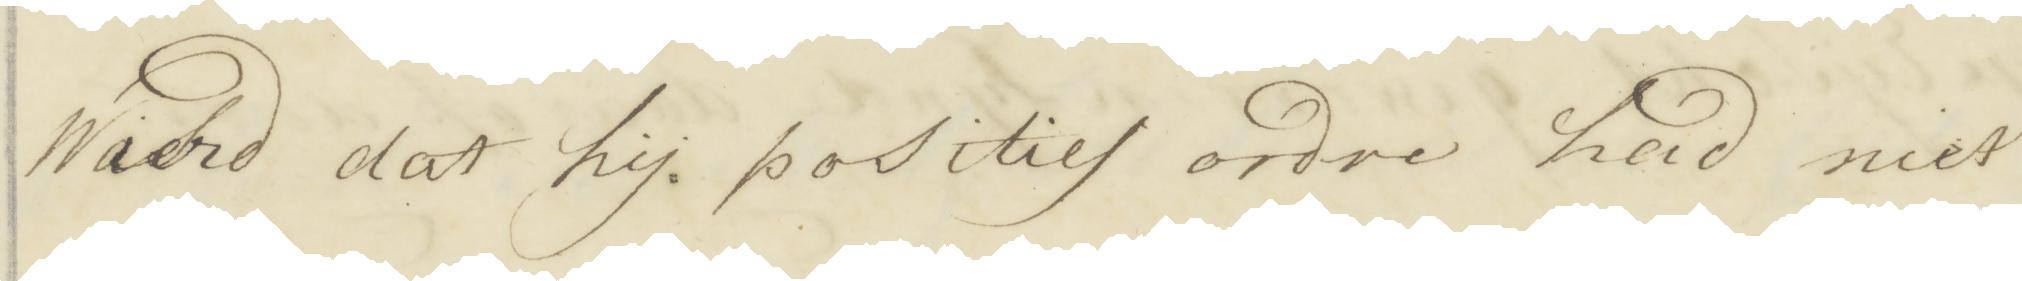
wierd dat hij positief ordre had niet
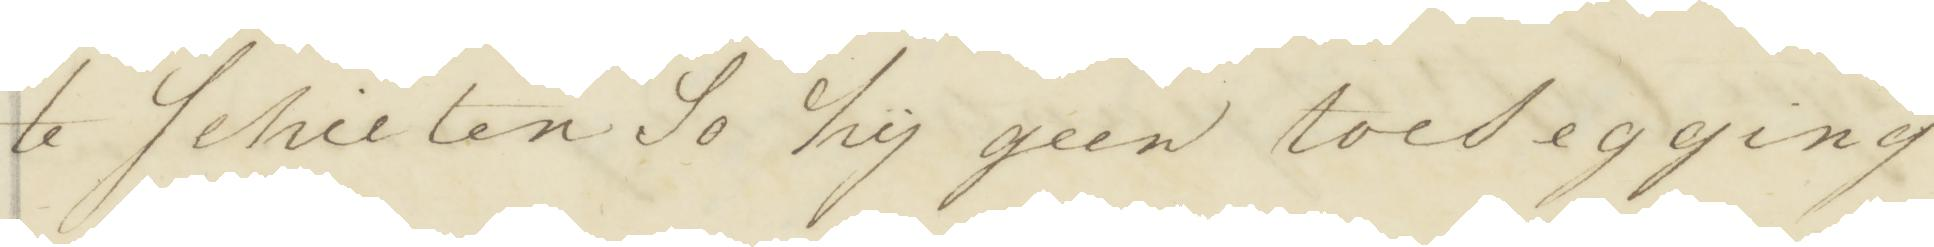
te schieten so hij geen toesegging
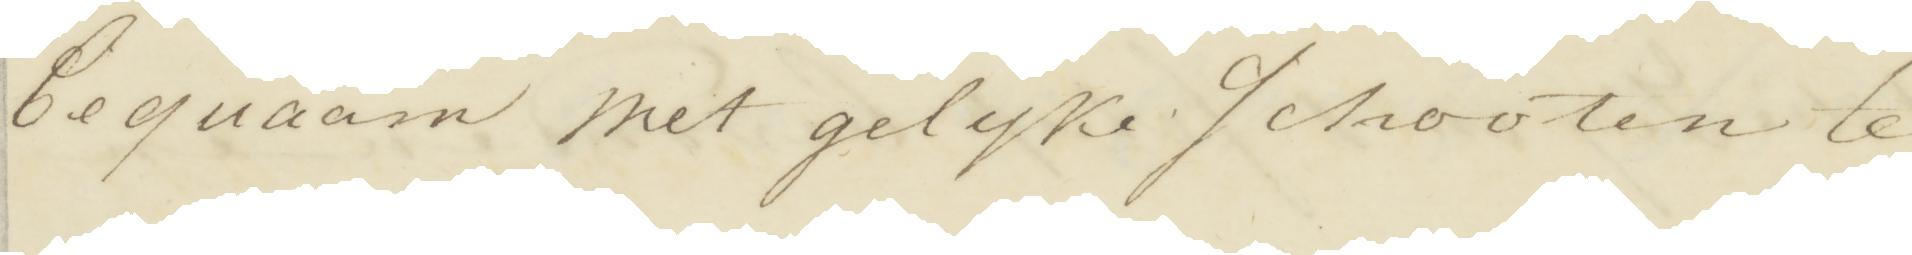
bequaam met gelyke schooten te
